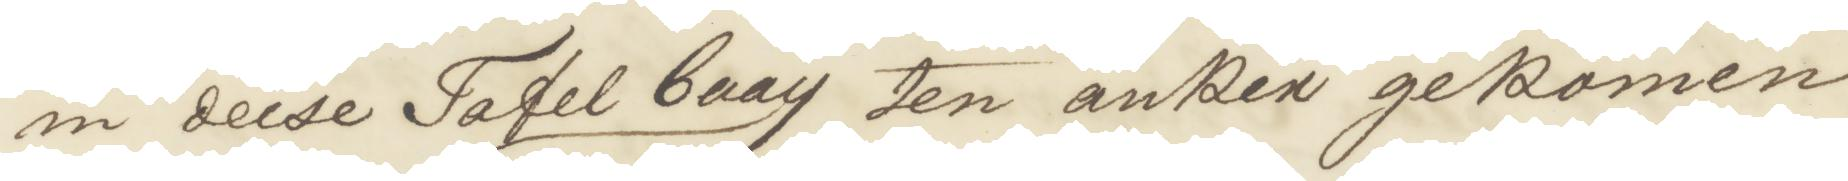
in deese Tafel baaij ten anker gekomen
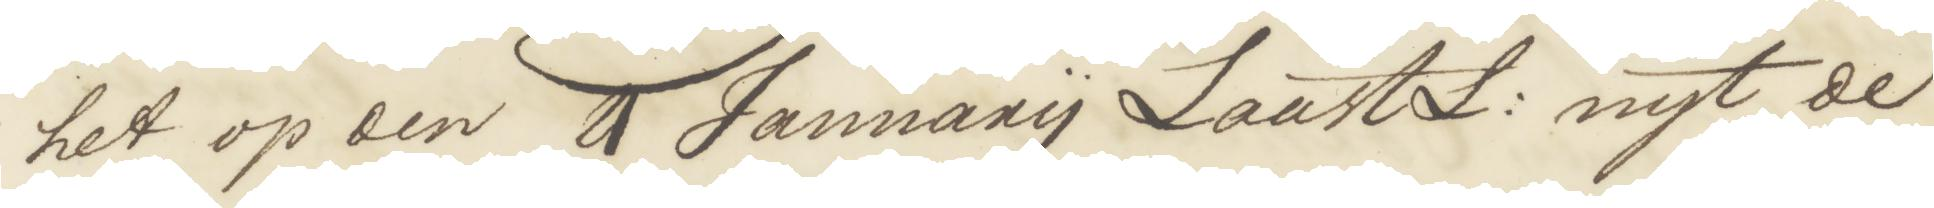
het op den 4 Januarij Laastl: uijt de
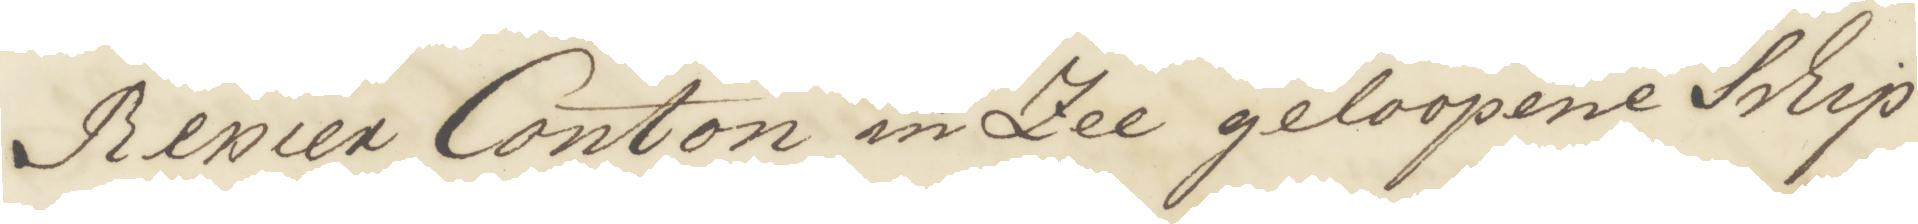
Revier Conton in zee geloopene schip
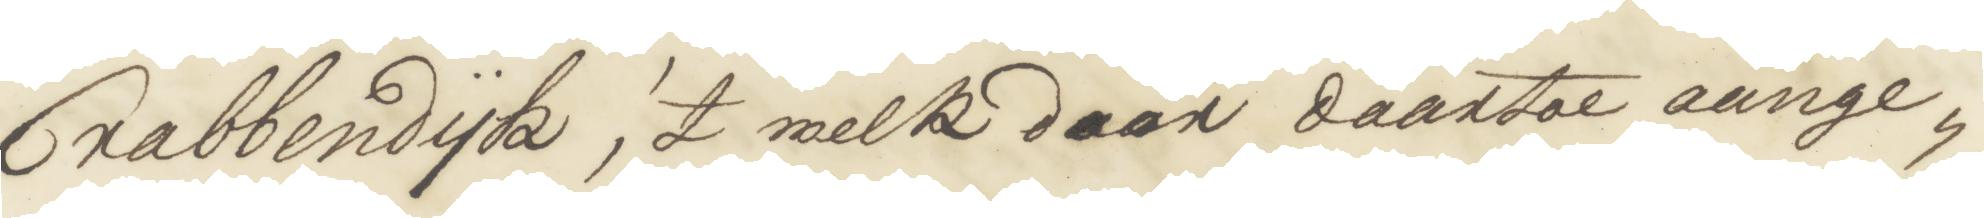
Crabbendijk, ’t welk daar daartoe aange„
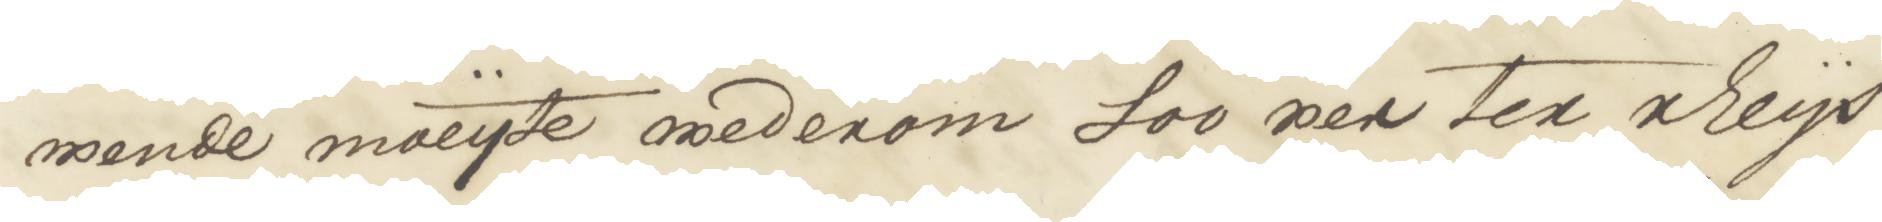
wende moeijte wederom soo ver ter rheijs
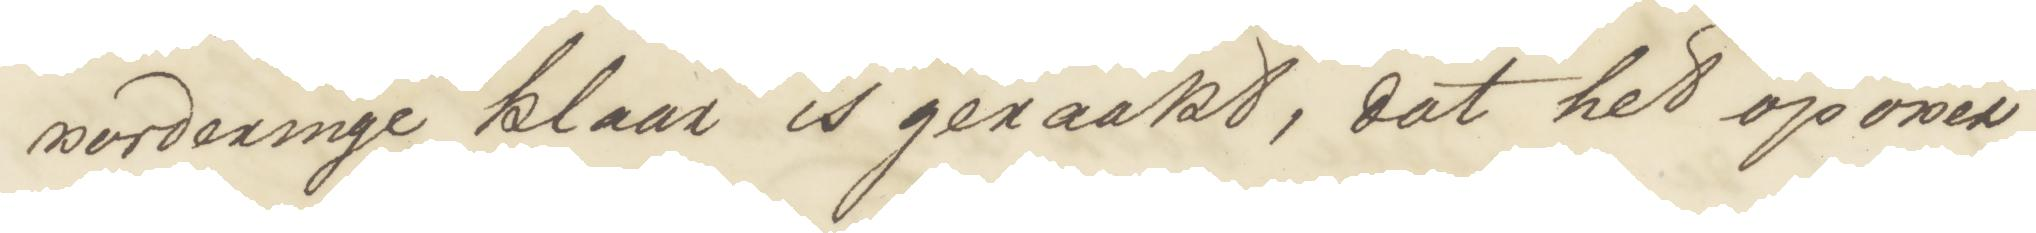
vorderinge klaar is geraakt, dat het op over
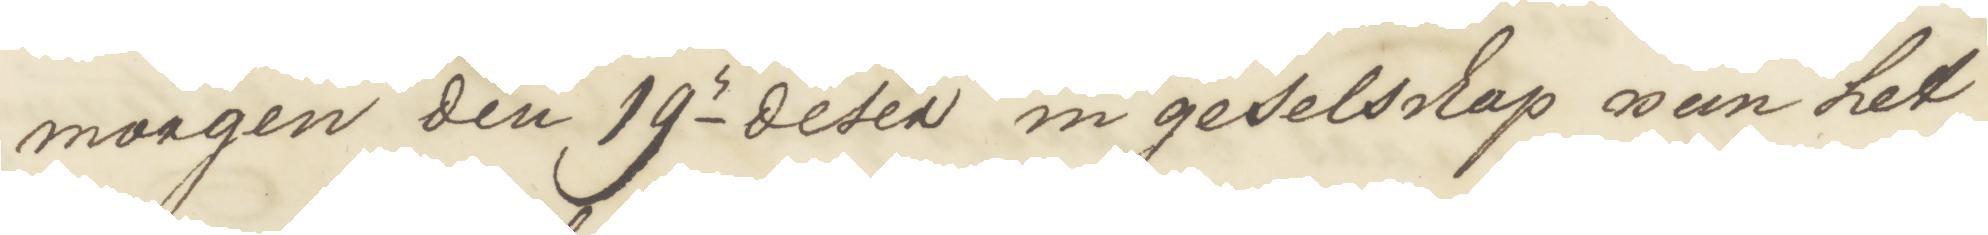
morgen den 19-" deser in geselschap van het
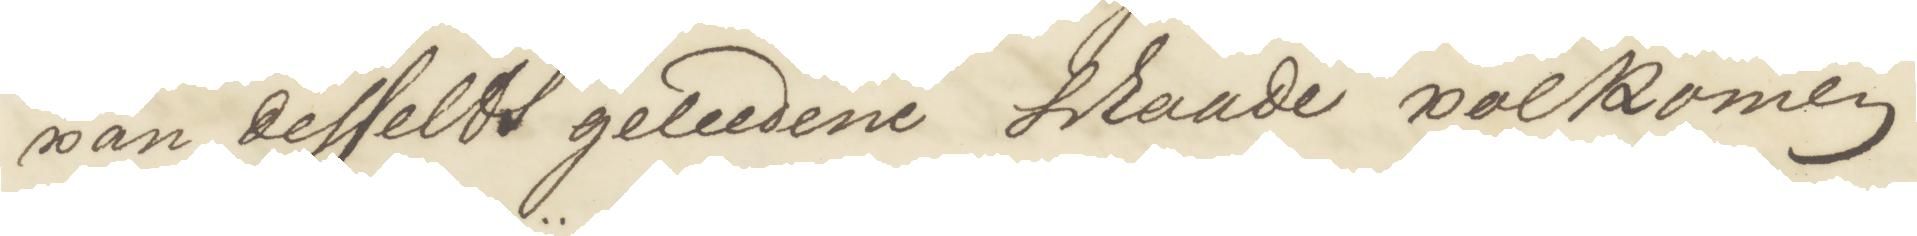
van desselfs geleedene schaade volkomen
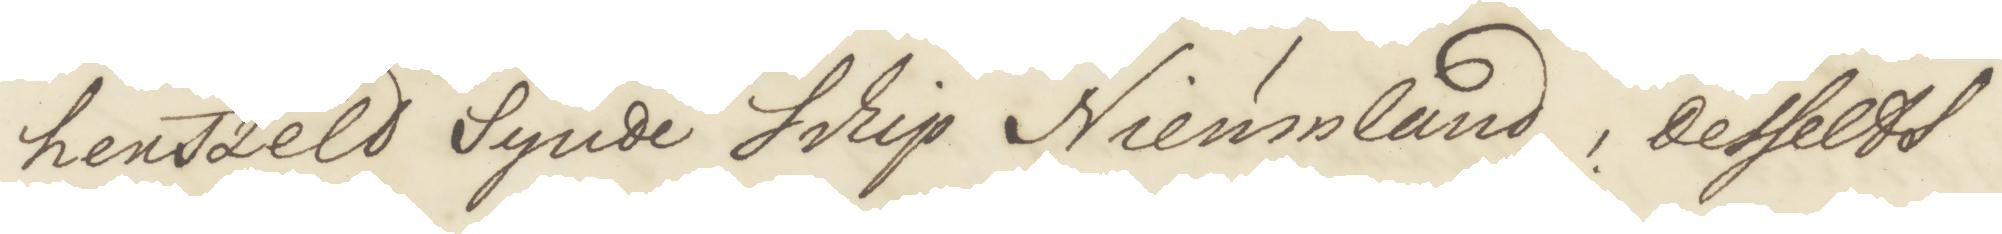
hersteld sijnde schip Nieuwland, desselfs
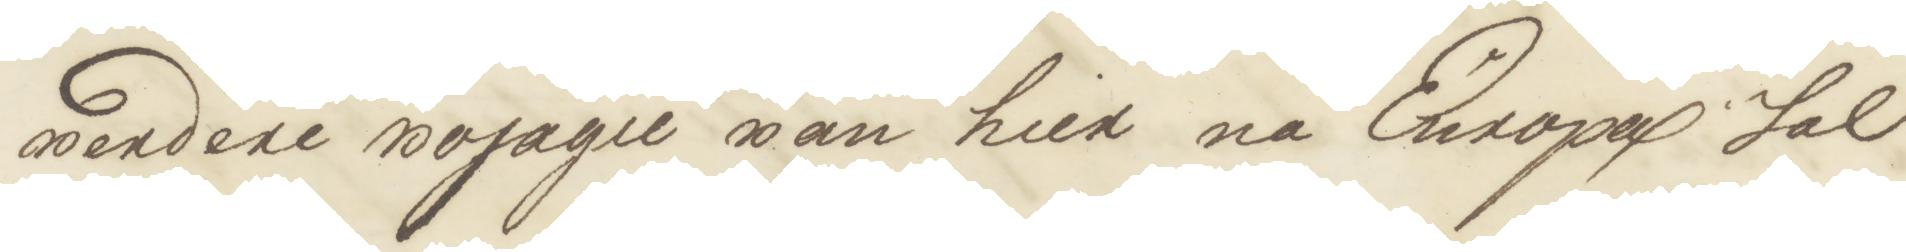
verdere vojagie van hier na Europa sal
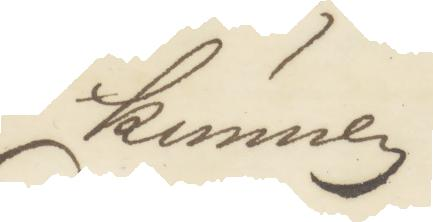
kunnen
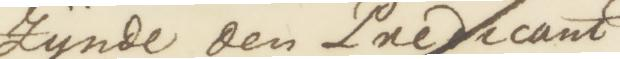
zijnde den Predicant
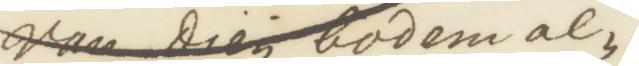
van dien bodem al
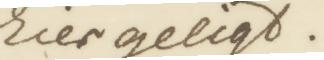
hier geligt.
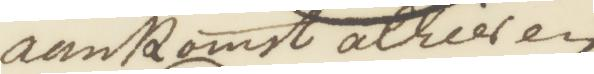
aankomst alhier en
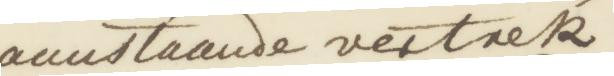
aanstaande vertrek
